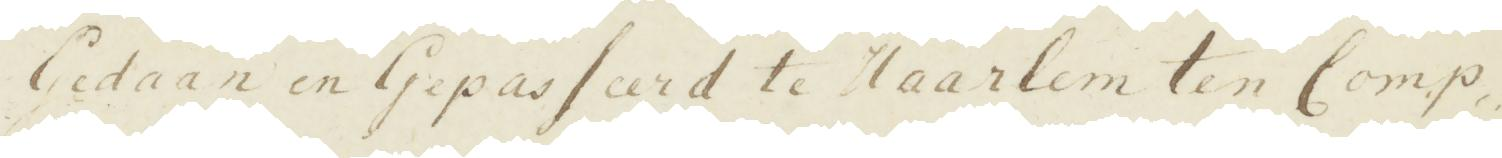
Gedaan en Gepasseerd te Haarlem ten Comp„
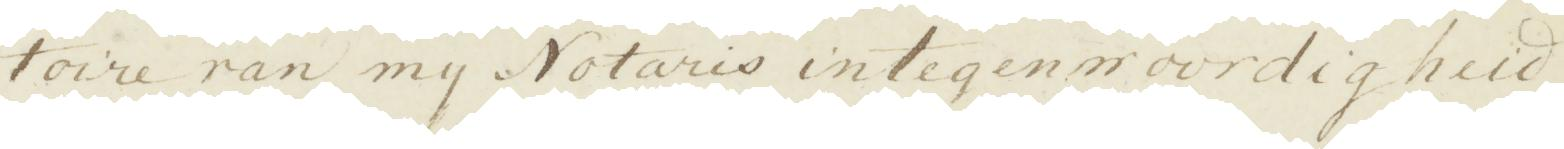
toire van my Notaris in tegenwoordigheid
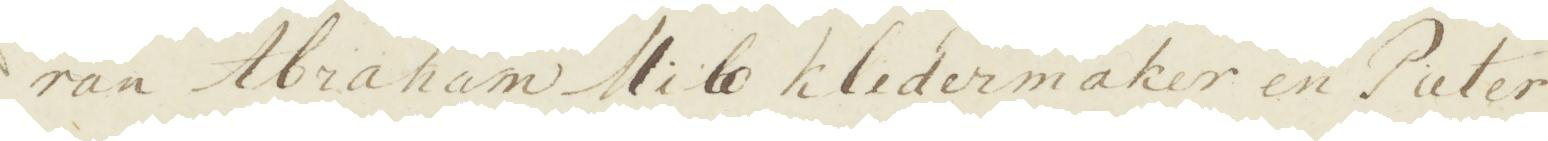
van Abraham Milo Kledermaker en Pieter
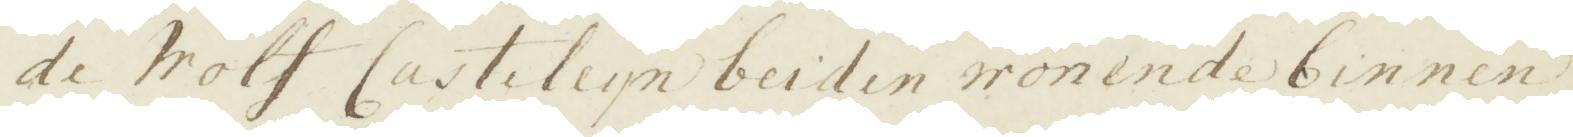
de Wolf Casteleyn beiden wonende binnen
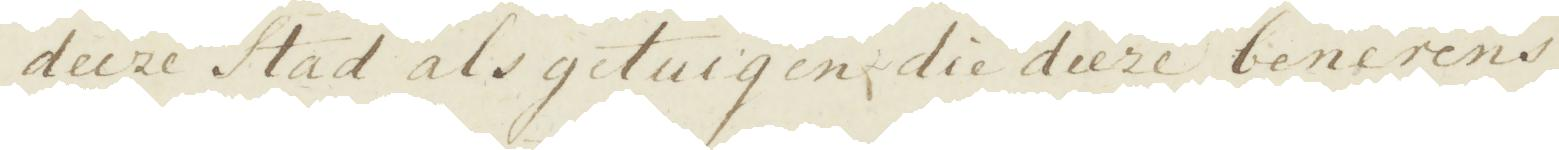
deeze stad als getuigen die deeze benevens
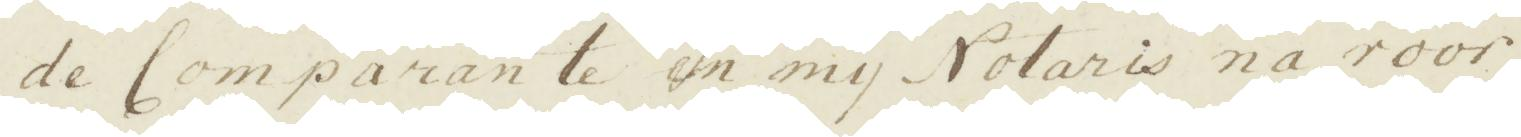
de Comparante en my Notaris na voor
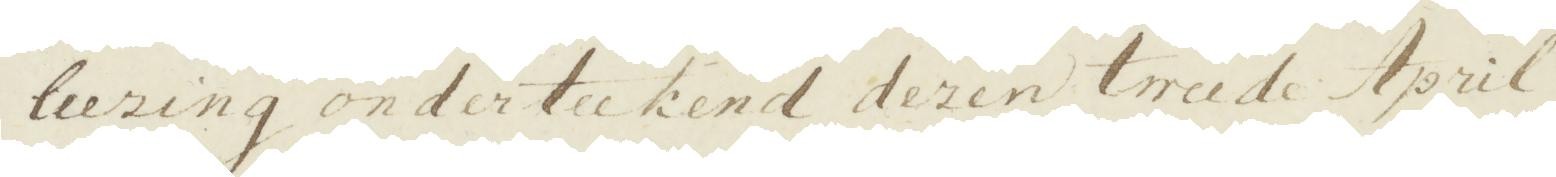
leezing onderteekend dezen tweede April
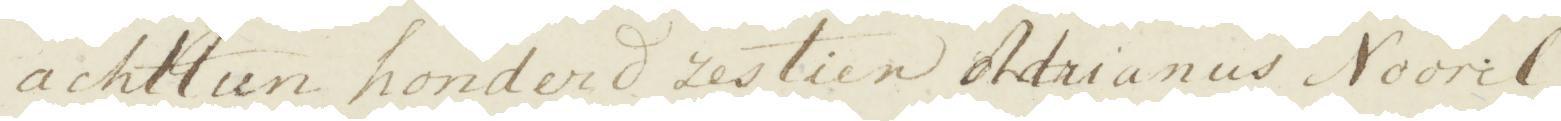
achttien honderd zestien Adrianus Noorel
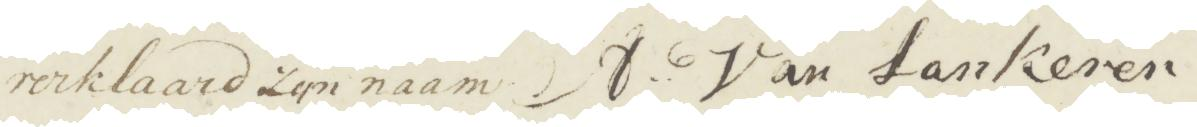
verklaard zyn naam A. Van Lankeren
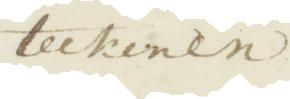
teekenen
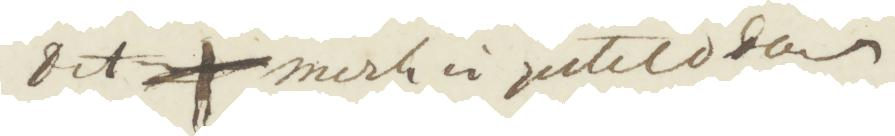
dit + merk is gesteld door
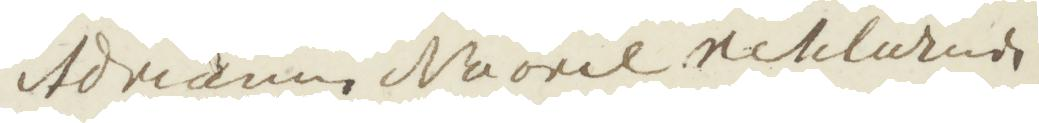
Adrianus Noorel verklarend
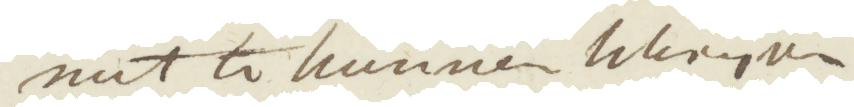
niet te kunnen schrijven
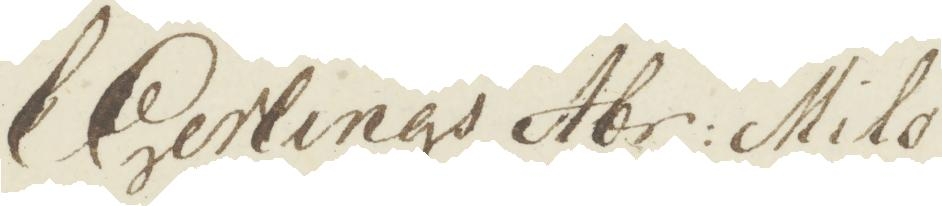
C Gerlings Abr: Milo
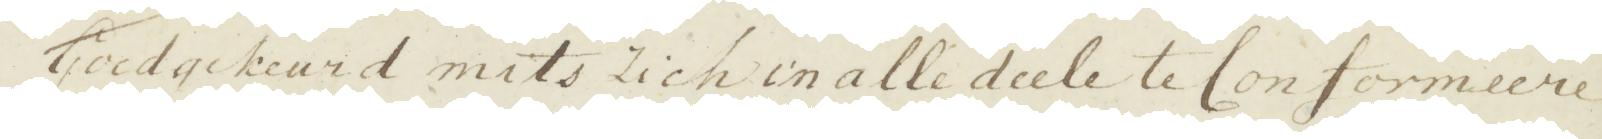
Goedgekeurd mits zich in alle deele te Conformeere
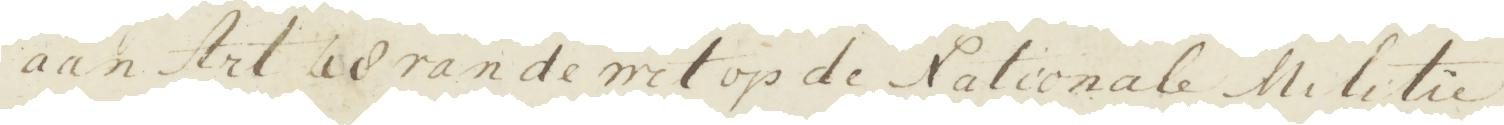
aan Art 48 van de wet op de Nationale Militie
